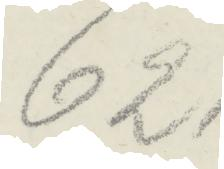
621
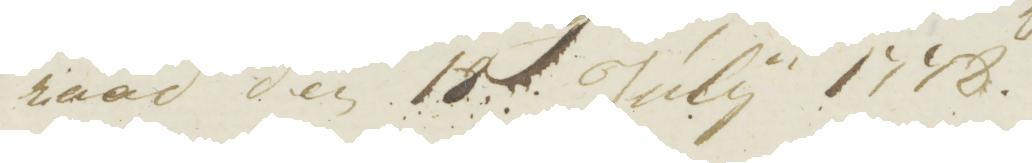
raad den 18: Julij 1778.
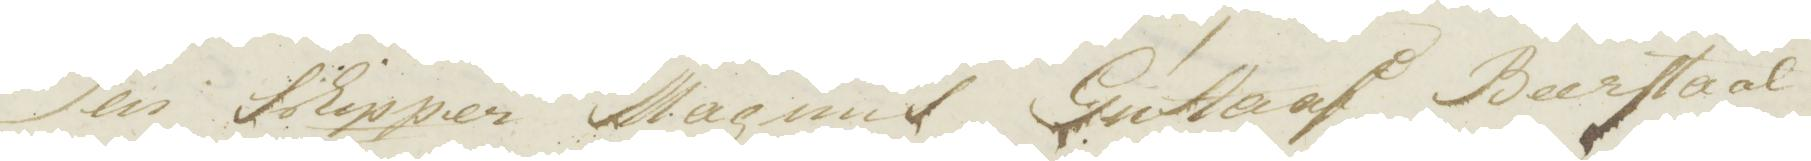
Den schipper Magnus Gustaaf Beerstaal
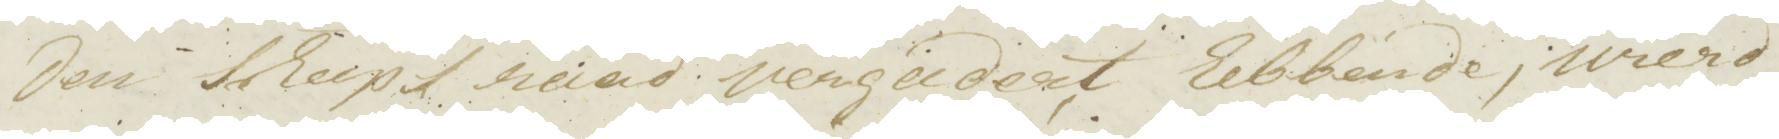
den scheeps raad vergadert hebbende, wierd
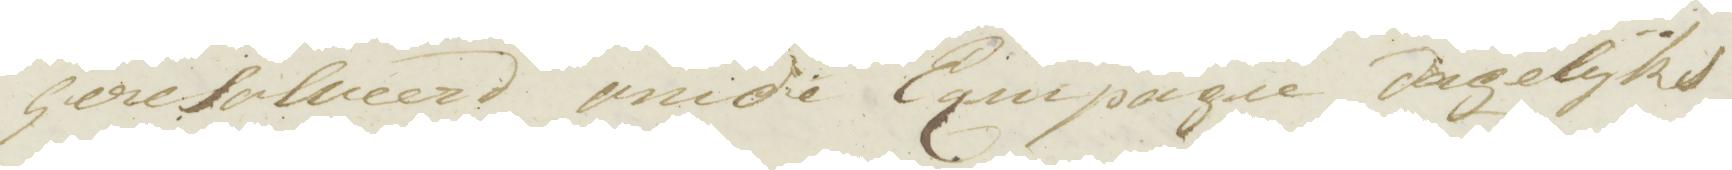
geresolveerd om de Equipagie dagelijks
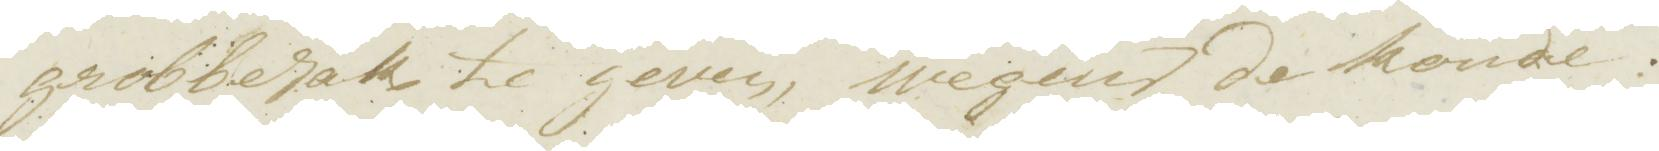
grobbejak te geven, wegens de koude .
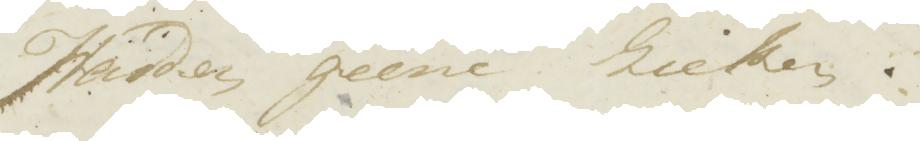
Hadden geene zieken .
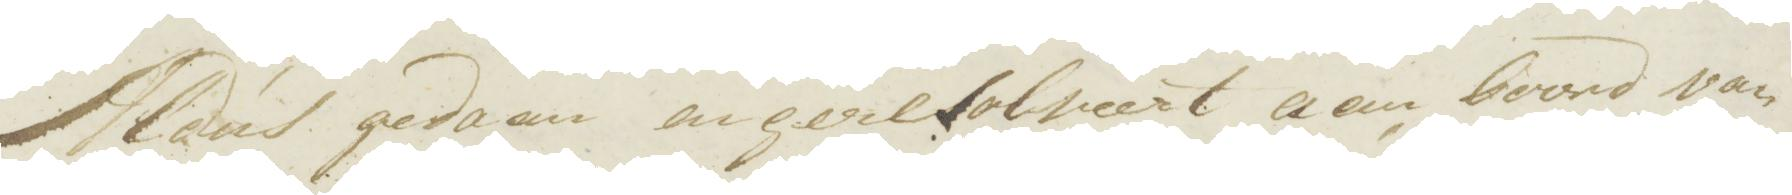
Aldus gedaan en geresolveert aan boord van
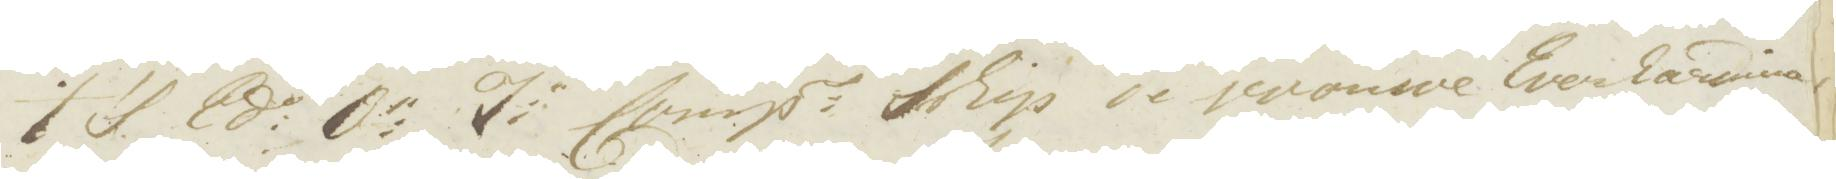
t 'S Ed:e O:“ I:n Comp=s schip de vrouwe Everhardina,
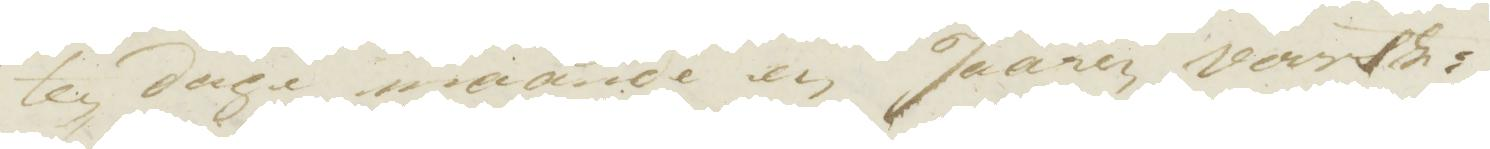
ten dage maande en Jaaren voorsch:
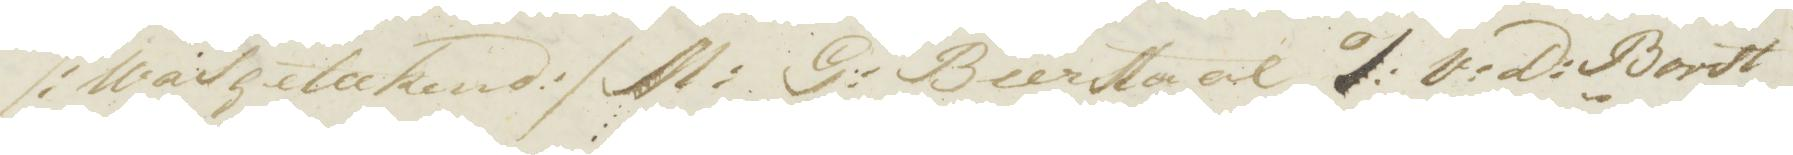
/:was geteekend:/ M: G: Beerstaal I: v: D: Borst
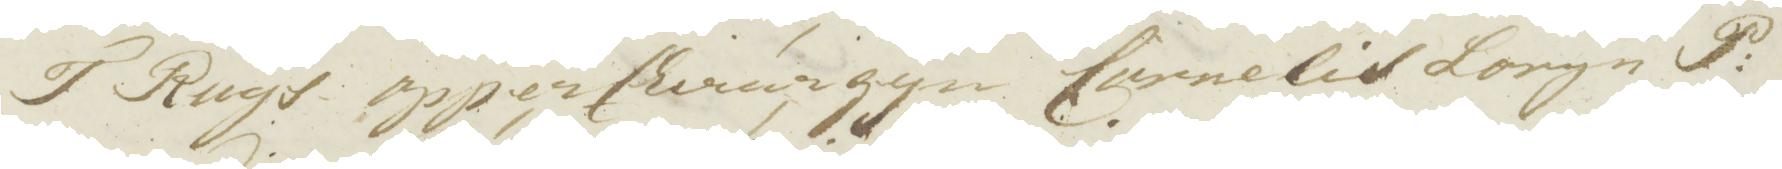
T Ruys opperchirurgijn Cornelis Loryn P:
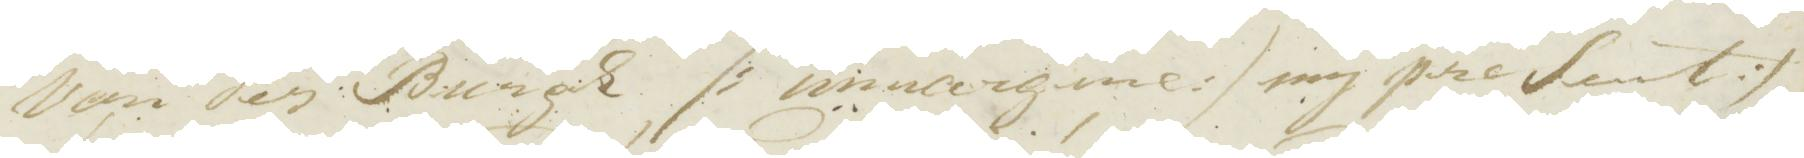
van den Burgh /: in margine:/ my present:/
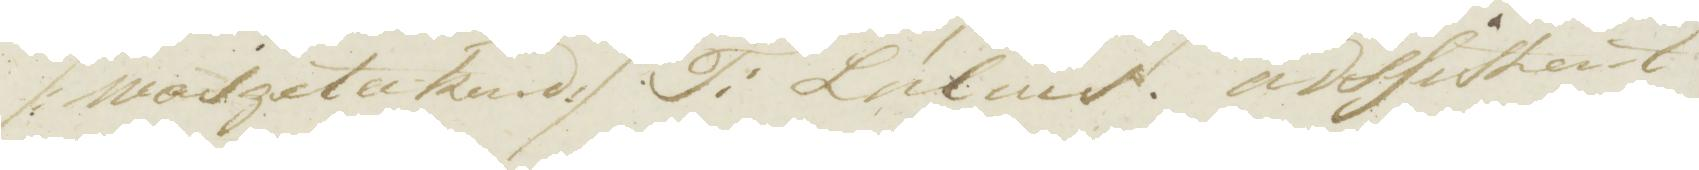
/:was geteekend/: T: Lucius. adssistent
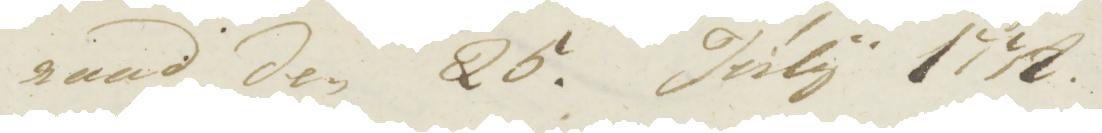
raad den 25. Julij 1778.
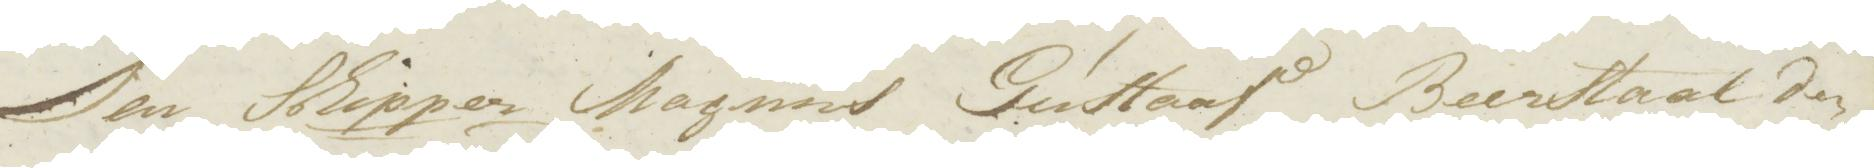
en Schipper Magnus Gustaaf Beerstaal den
